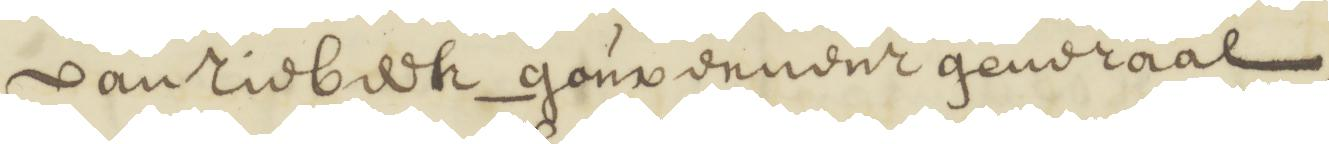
van riebeek gouverneur generaal,
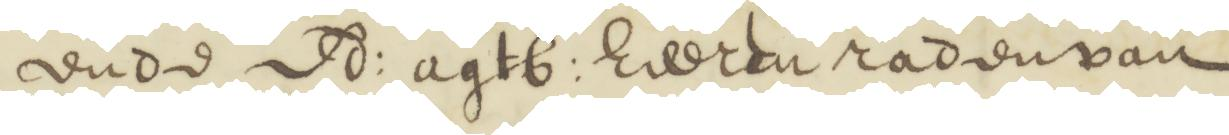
en de Ed: agtb: heeren raden van
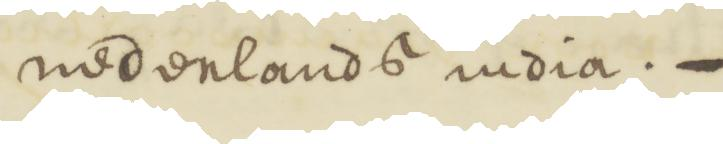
nederlands india. —
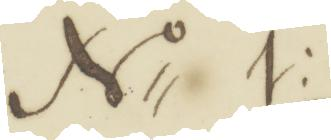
N„o 1:
